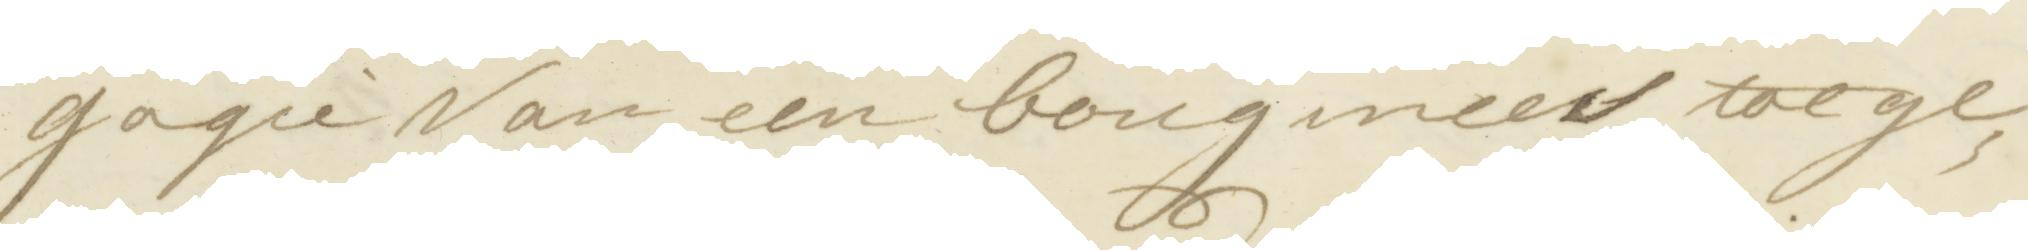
gagie van een bouginees toege„
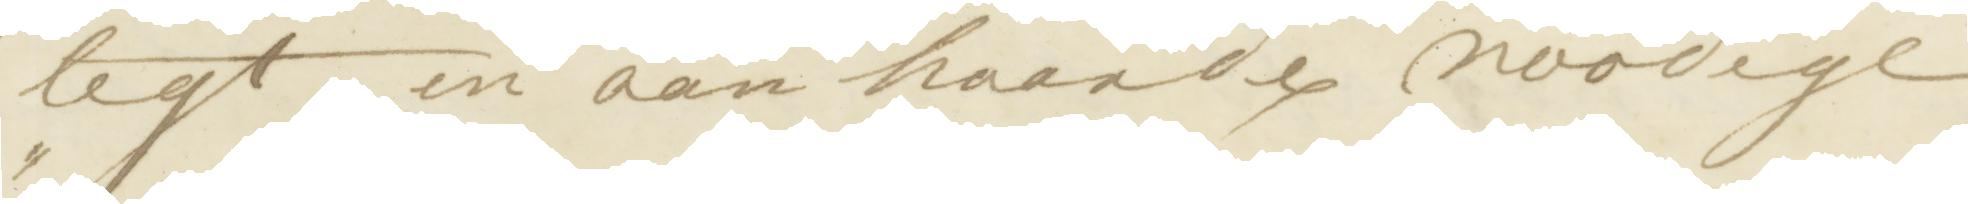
legt, en aan haar de noodige
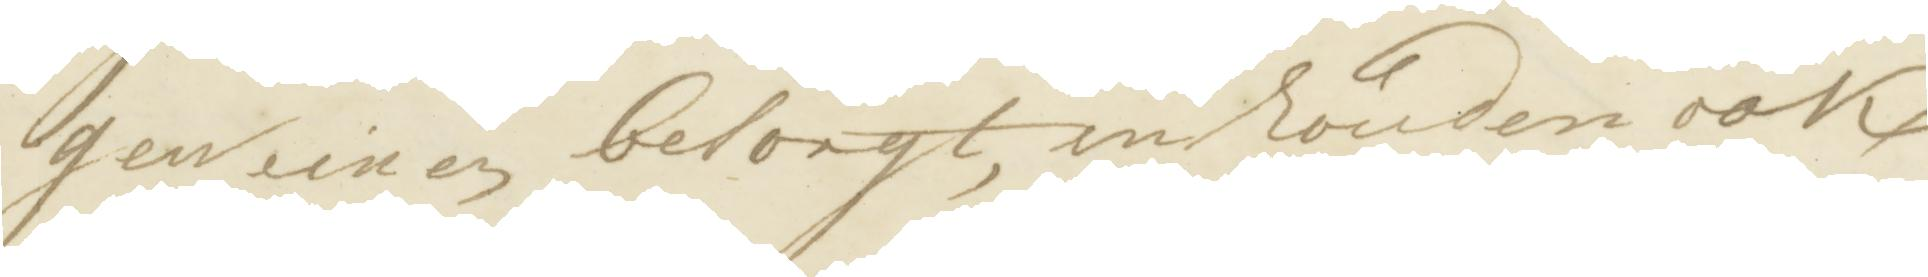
geweeren besorgt, en houden ook
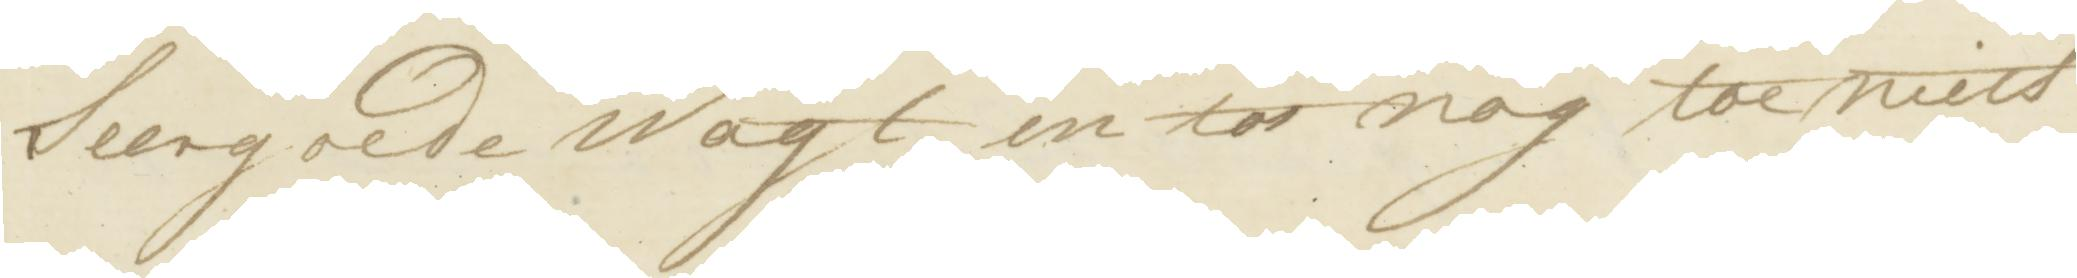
seer goede wagt en tot nog toe niets
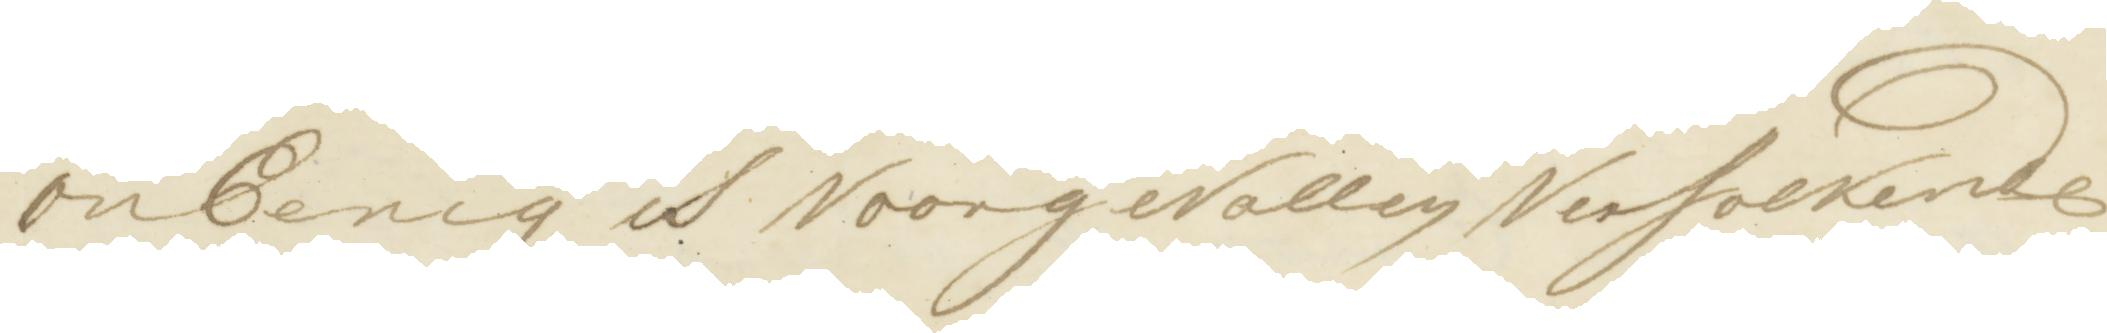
onEenig is voorgevallen versoekende
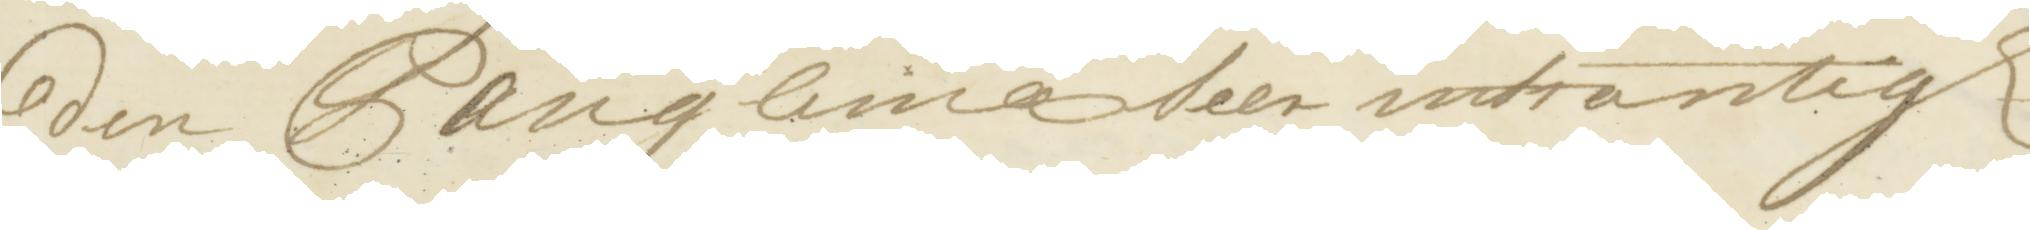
den Panglima seer instantigh
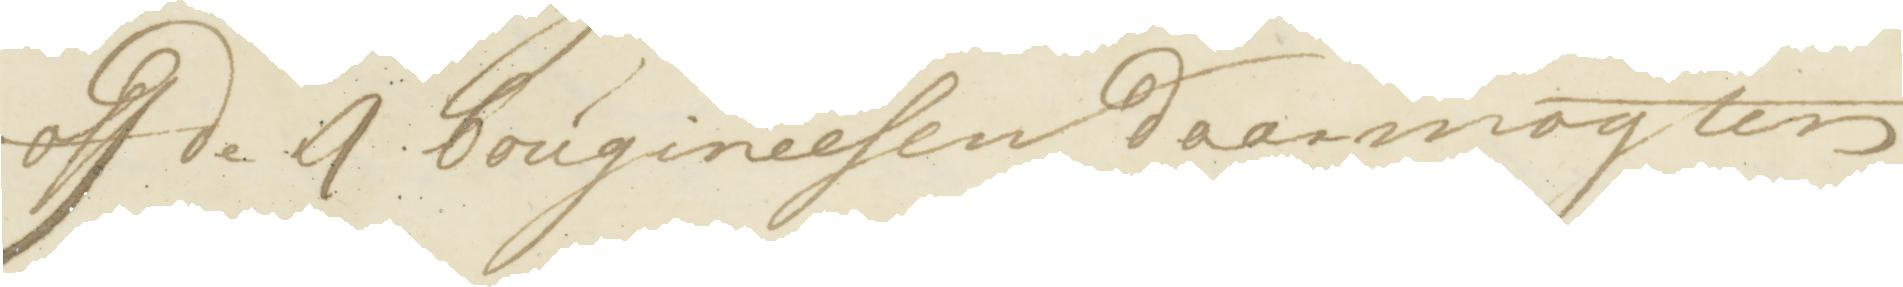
off de 4: bougineesen daar mogten
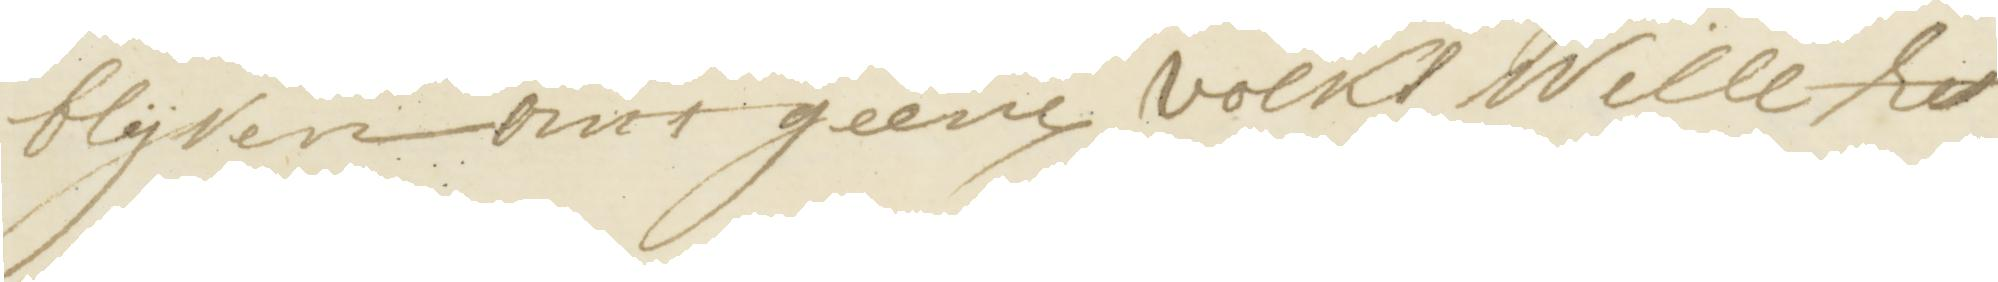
blijven omt geene volks wille het
